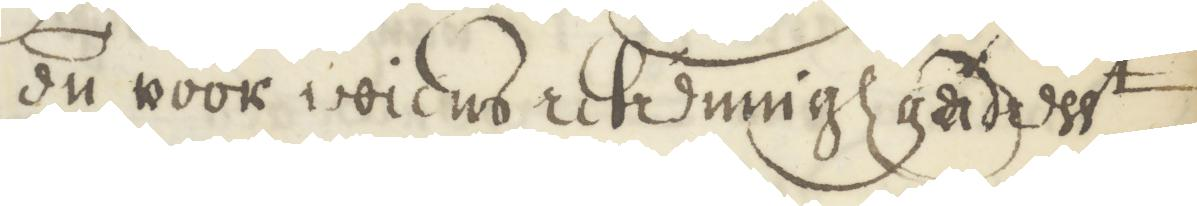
en voor wiens rekeningh gadresst
